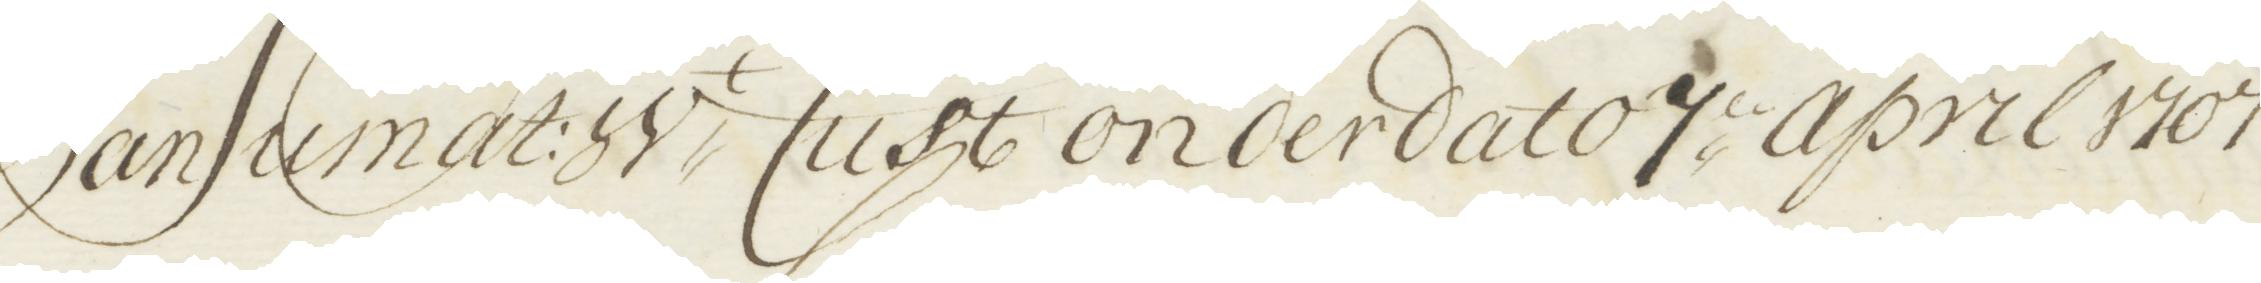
Van Sumat:s w„t Cust onder dato 7„en april 1707:
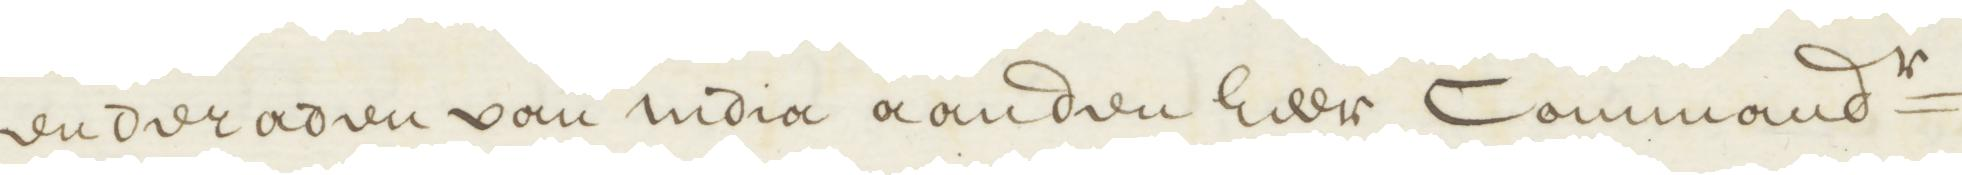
en der aden van india aan den heer Command=r
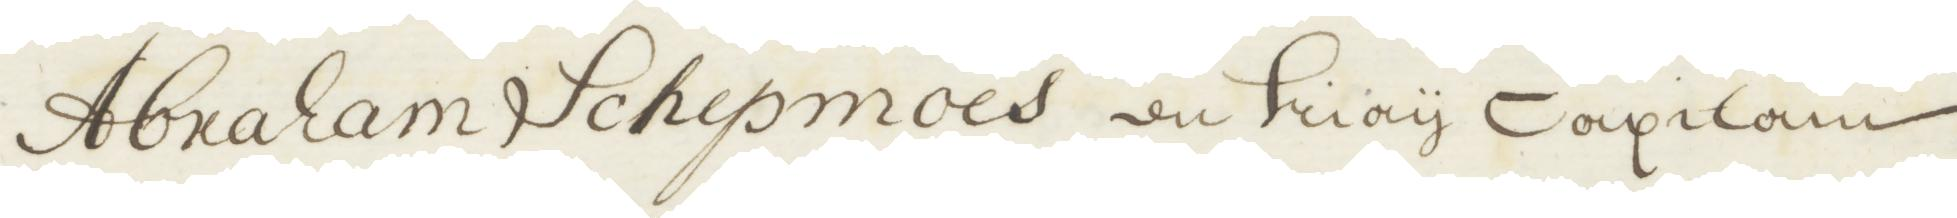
Abraham Schepmoes en kiaij Capitain
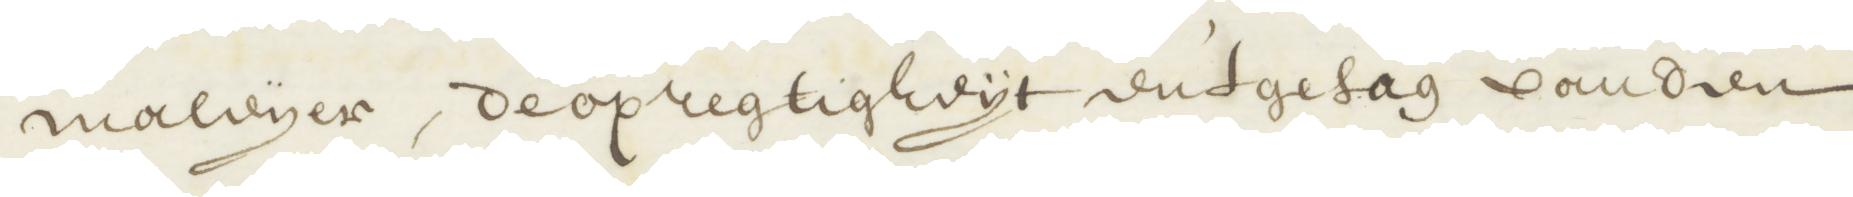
maleijer, de opregtigheijt en 't gesag van den
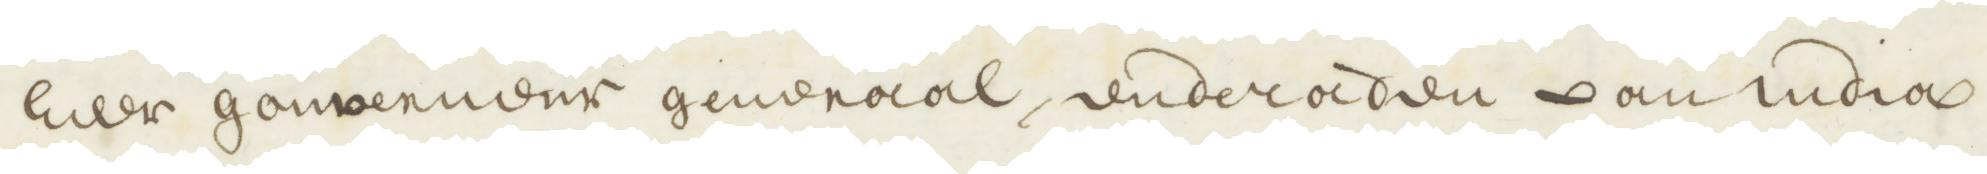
heer gouverneur generaal, ende raden van india
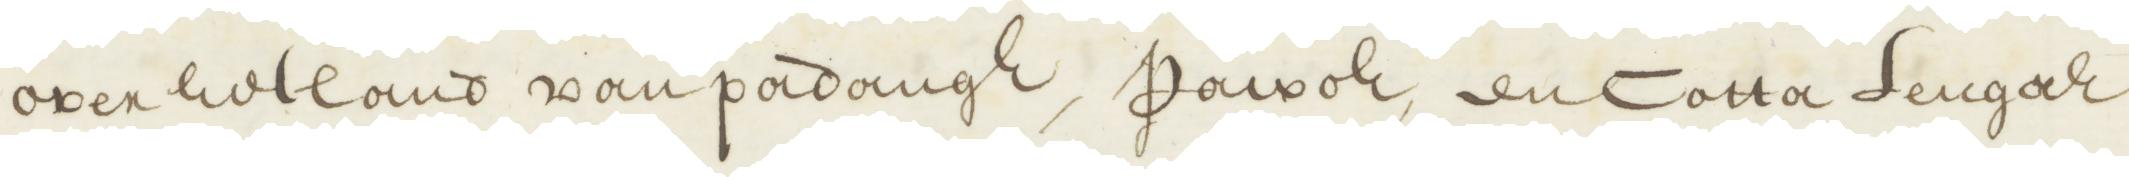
over het land van padangh, Pawoh, en cotta tengah
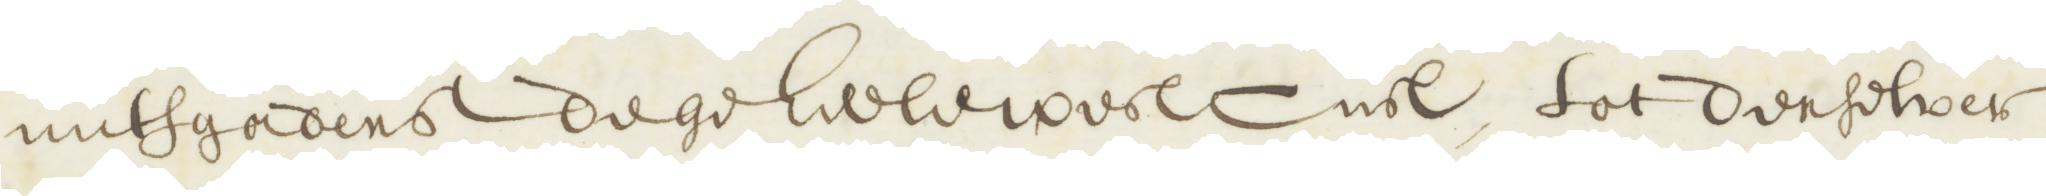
mitsgaders de geheele westcust tot derselver
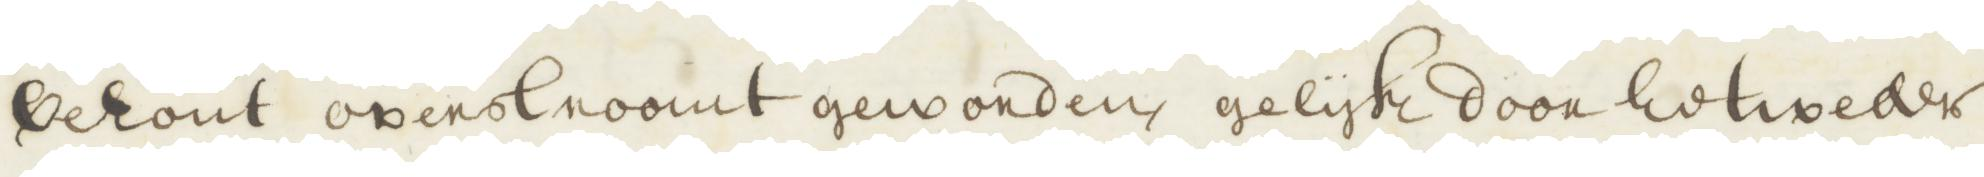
behout overstroomt geworden, gelijk door hetweder
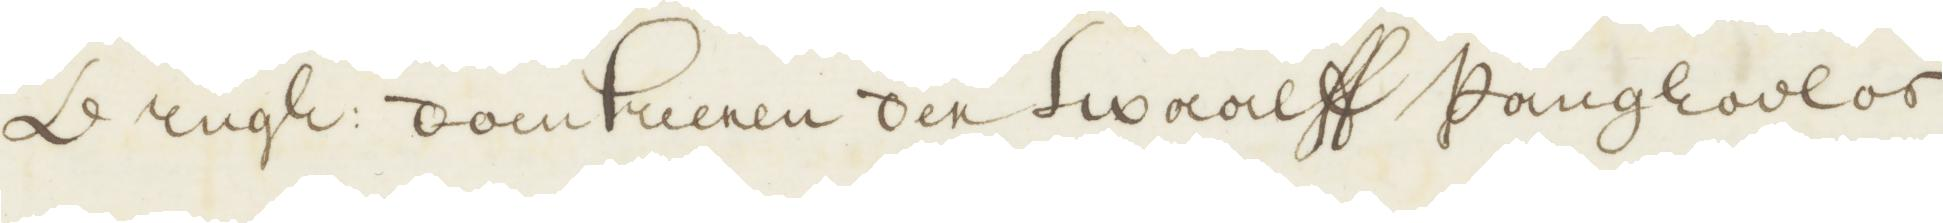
te rugh:e doen keeren der twaalff Panghoelos
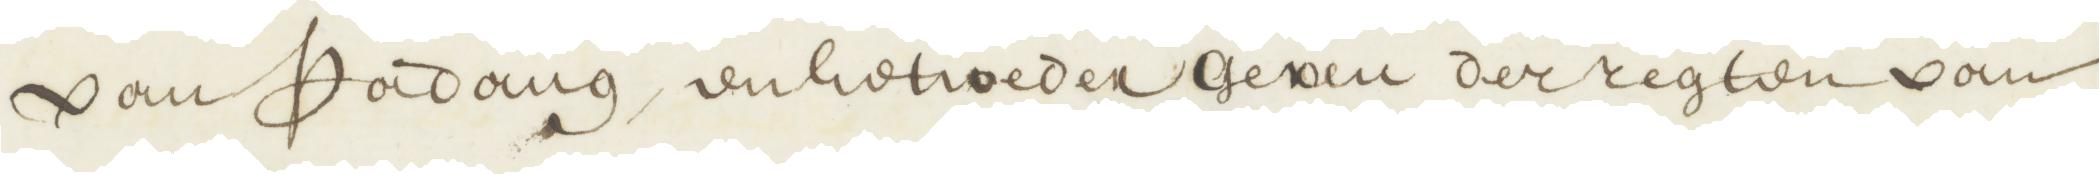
van Padang, en hetwedergeven der regten van
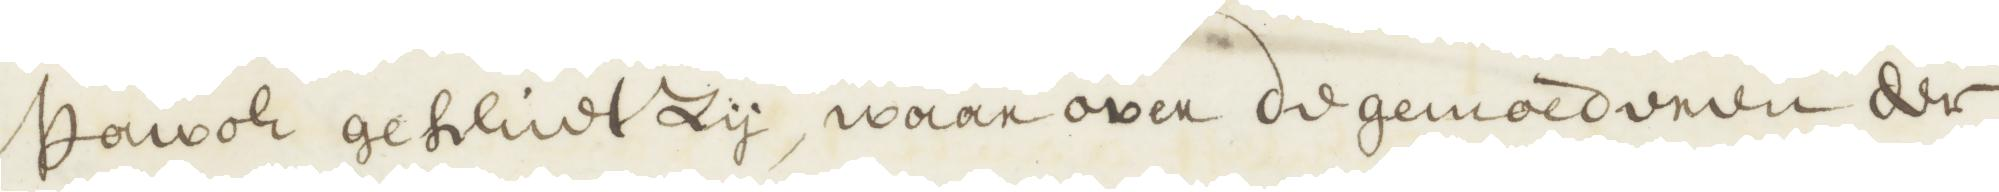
Pawoh geschiet zij, waar over de gemoederen der
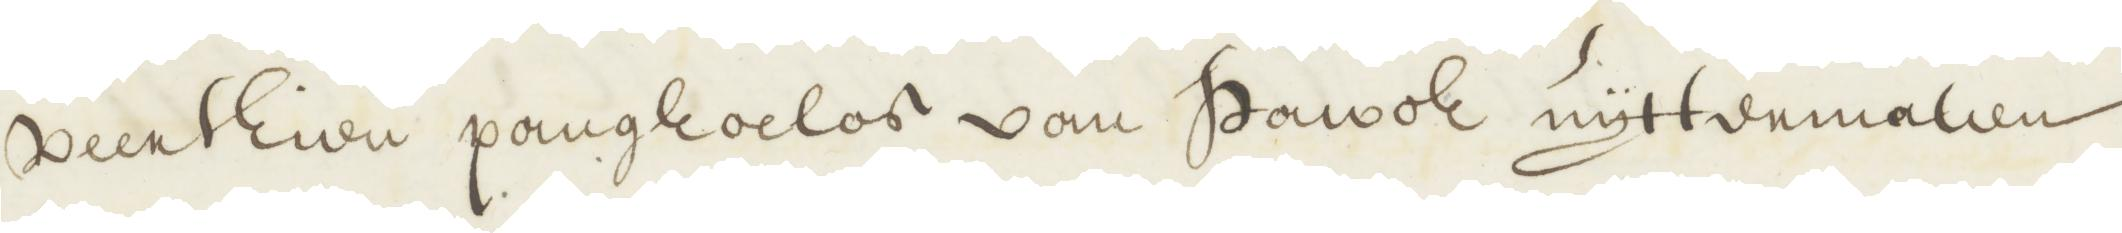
veerthien panghoelos van Pawoh uijttermaten
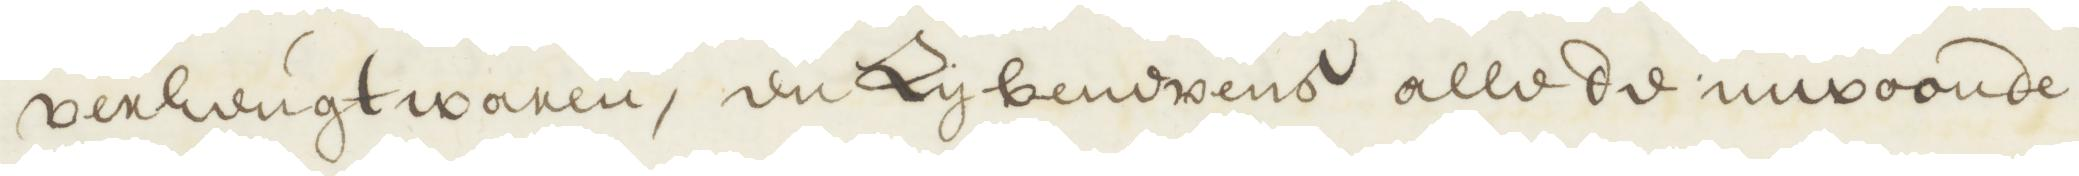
verheugt waren, en zij benevens alle de inwoonde
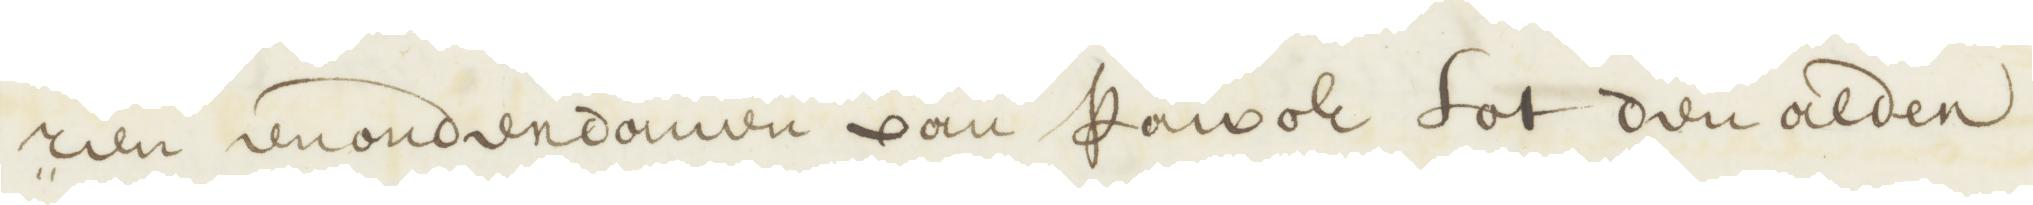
„ren en onderdanen van Pawoh tot den alden
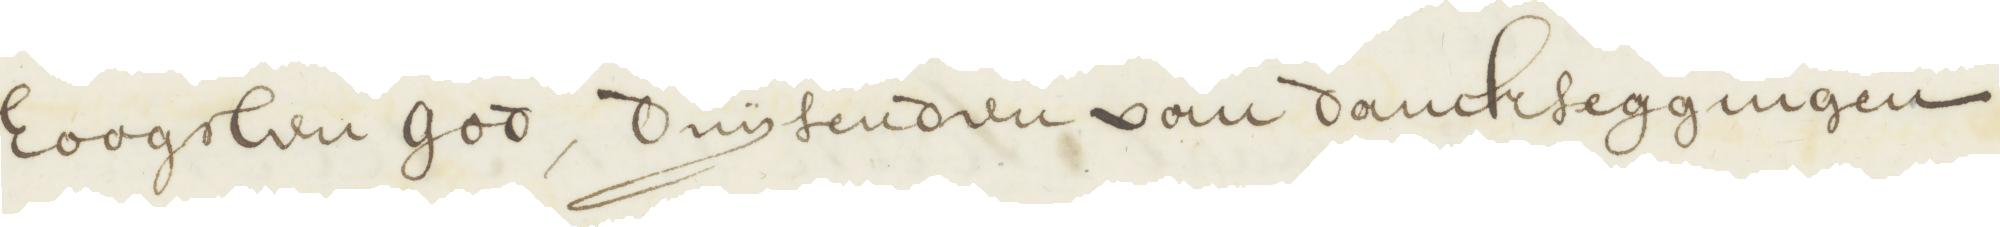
hoogsten god, duijsenden van danckseggingen
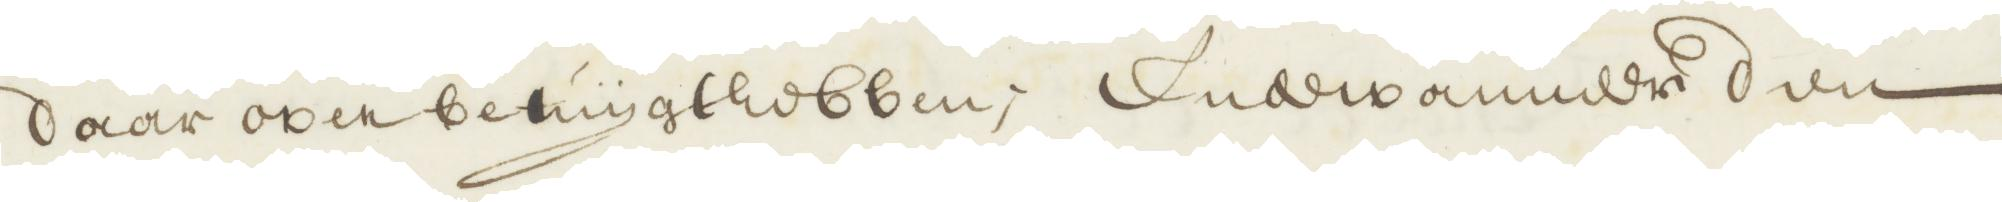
daar over betuijgthebben; Endewanneer den
